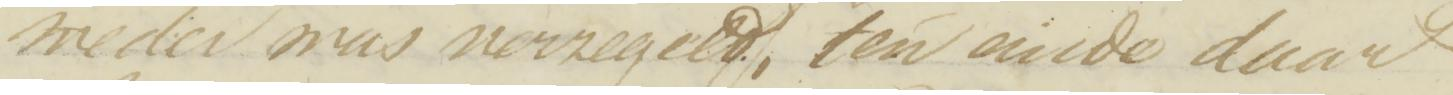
weder was verzegeld, ten einde daar
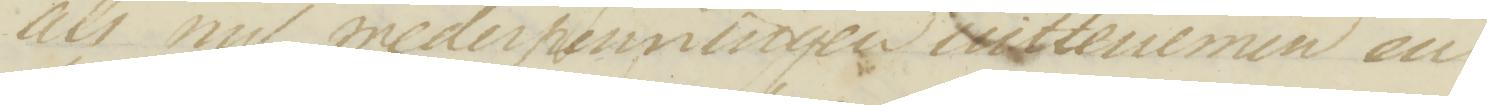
als nu weder penningen uittenemen en
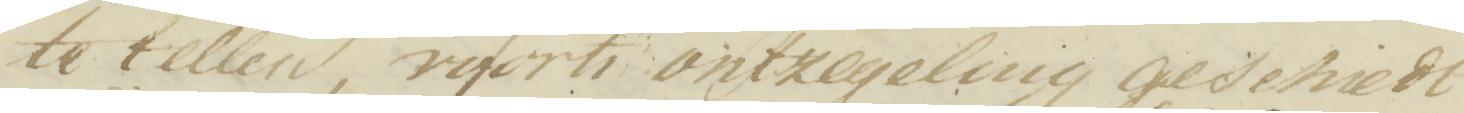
te tellen, voorts ontzegeling geschiedt
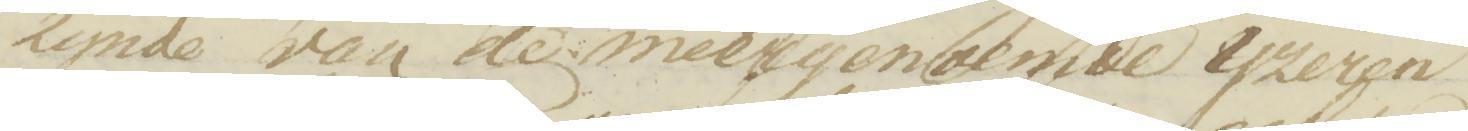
zijnde van de meergenoemde yzeren
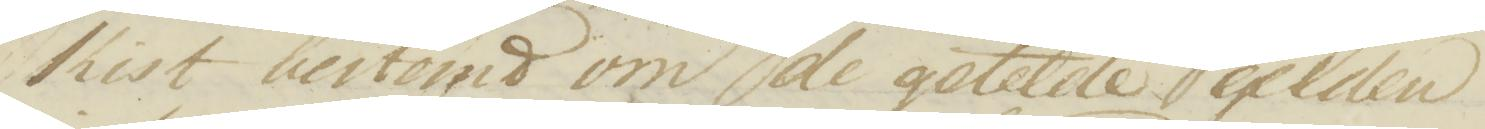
kist bestemd om de getelde gelden
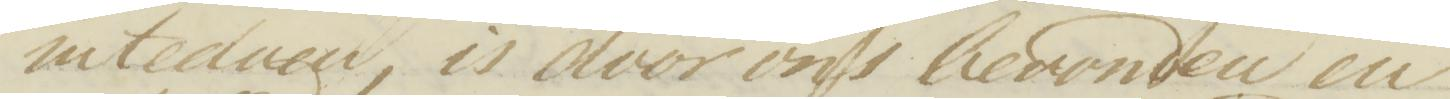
in te doen, is door ons bevonden en
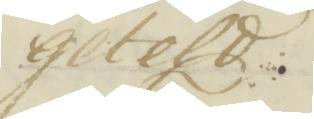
geteld.
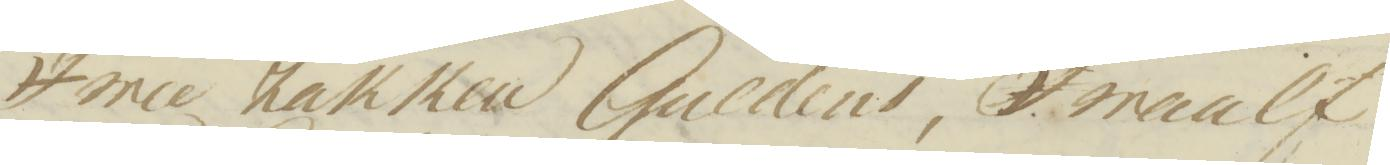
Twee Zakken Guldens, Twaalf
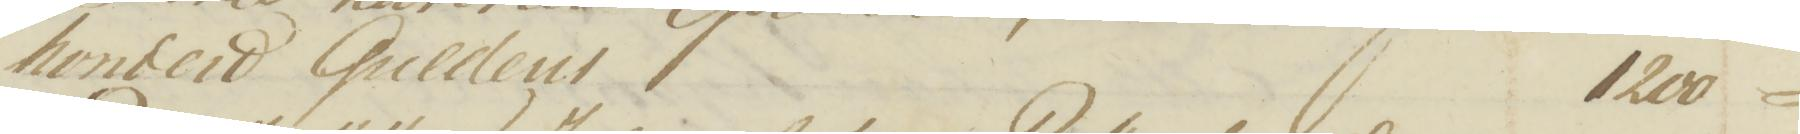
honderd Guldens 1200 =
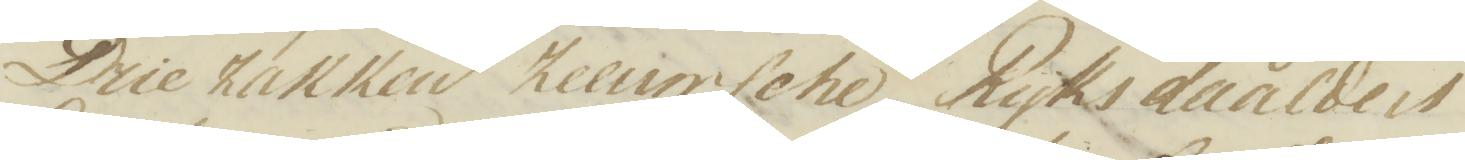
Drie zakken Zeeuwsche Rijks daalders
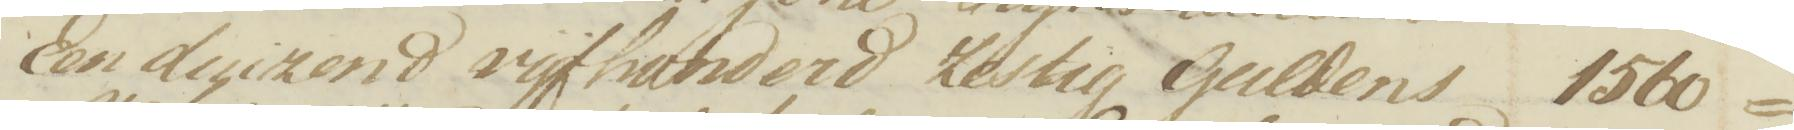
Een duizend vijfhonderd Zestig Guldens 1560 =
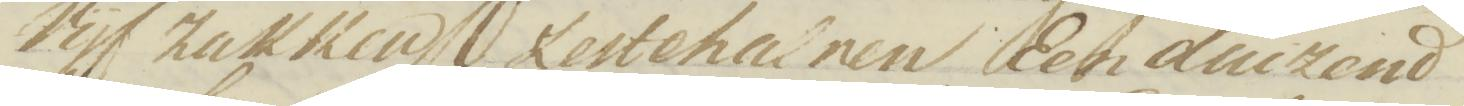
Vijf zakken Zestehalven Een duizend
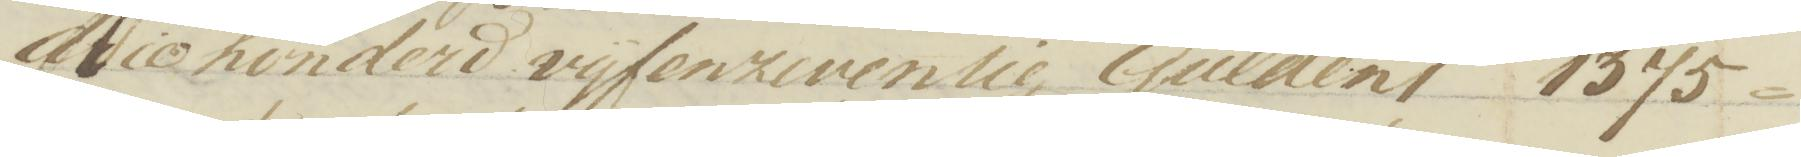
drie honderd vijfenzeventig Guldens 1375 =
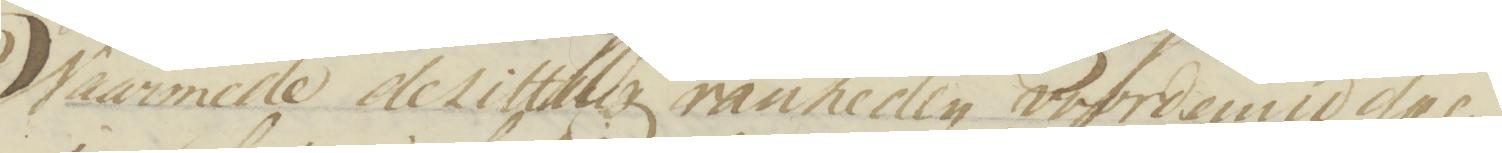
Waarmede de zitting van heden voordemiddag
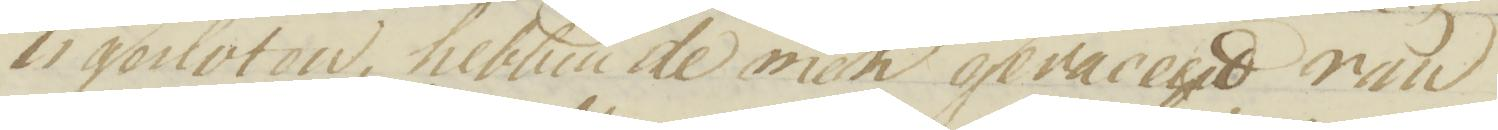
is gesloten hebbende men gevaceerd van
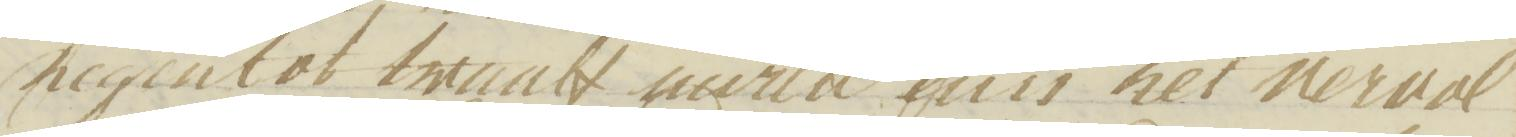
negen tot twaalf uuren en is het vervol
